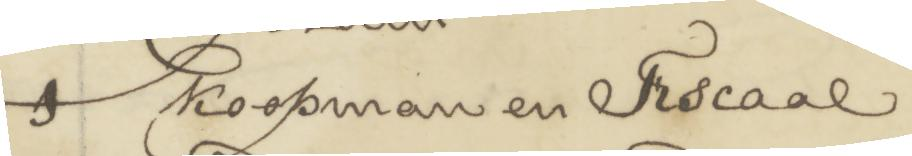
1 koopman en Fiscaal
